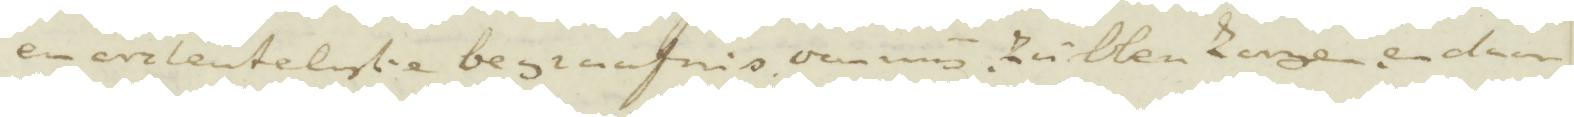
en ordentelyke begraafnis, van mij zullen zorgen, en daar
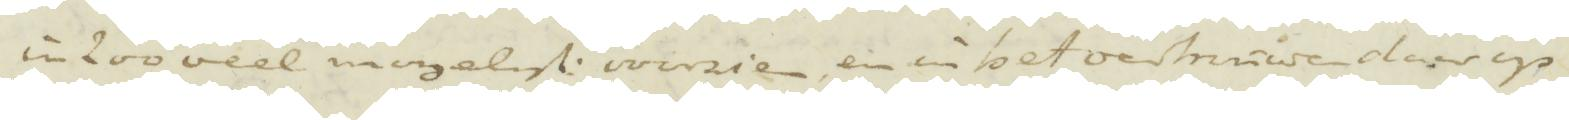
in zoo veel mogelyk voorzien, en in het vertrouwen daar op
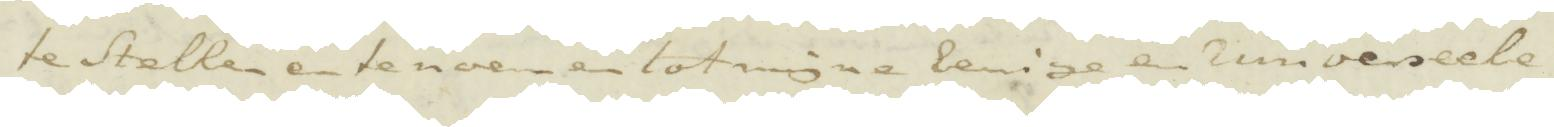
te stellen en te noemen tot mijne Eenige en Universeele
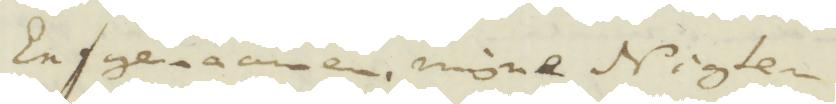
Erfgenaamen, mijne Nigten
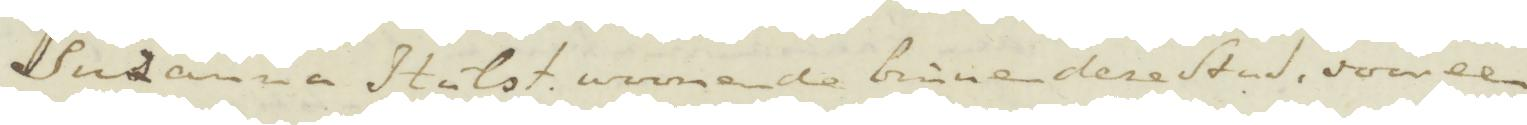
Susanna Hulst. woonende binnen deze stad, voor een
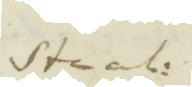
staak
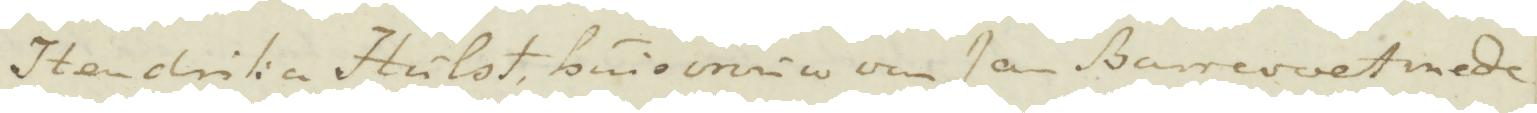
Hendrika Hulst, huisvrouw van Jan Barreroet mede
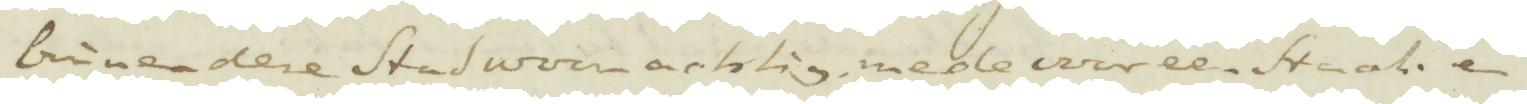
binnen deze stad woonachtig, mede voor een staak en
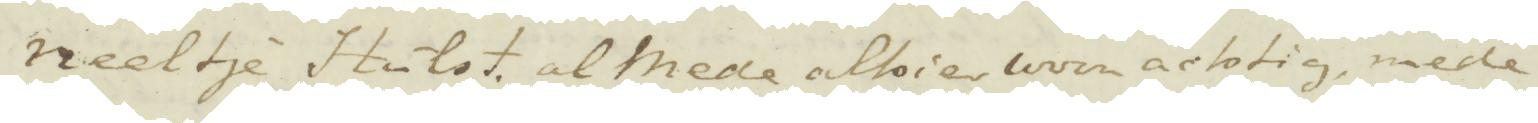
Neeltje Hulst, al mede alhier woonachtig, mede
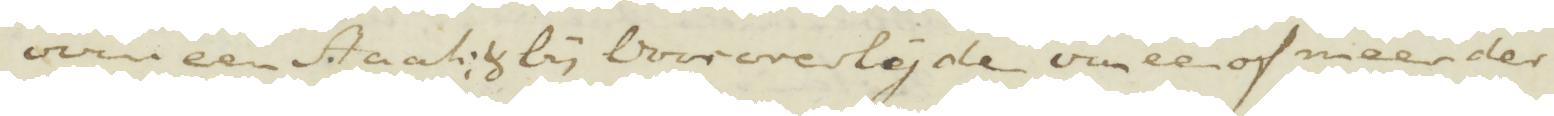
voor een staak & bij vooroverlijden van een of meerder
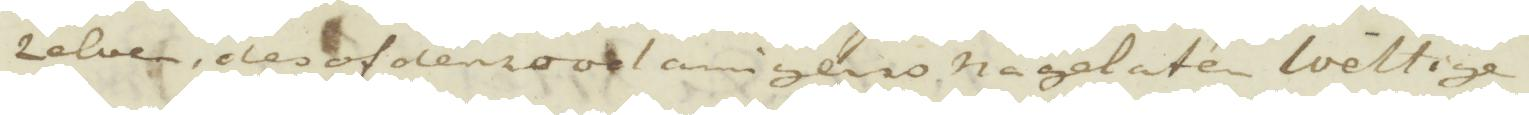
zelven, des of den zoodaningens nagelaten wettige
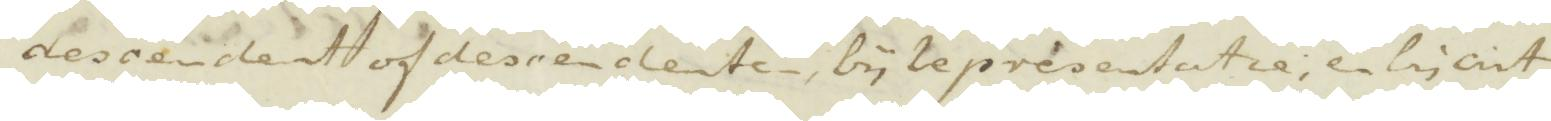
descendent of descendenten, bij representatie; en bij ont
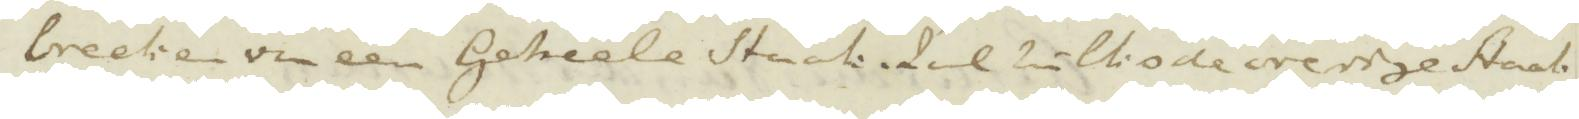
breeken van een Geheele staak zal zulks de overige staak
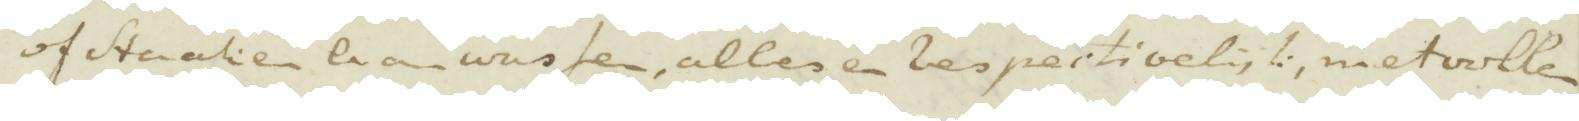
of staaken Aanwassen, alles en respectivelijk, met vollen
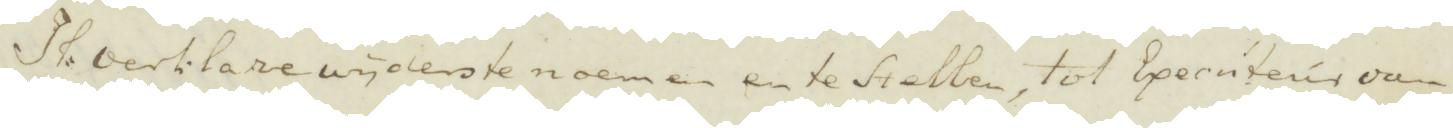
Jk verklare wijders te noemen en te stellen, tot Executeur van
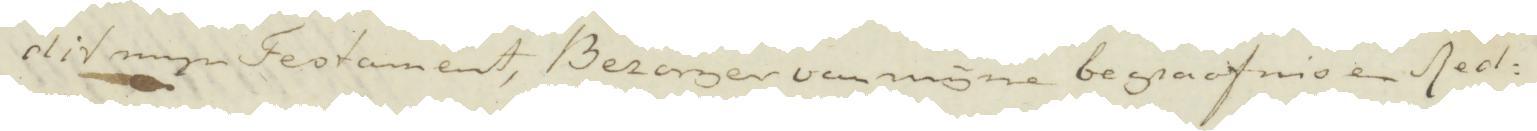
dit myn Testament, Bezorger van mijne begraafnis en Red=
